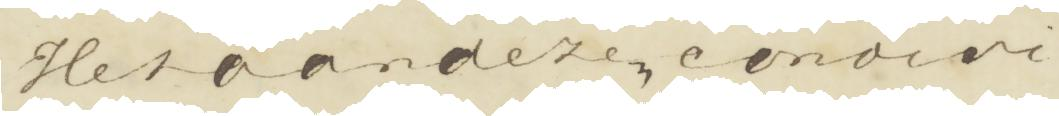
Het aan dezen condivi
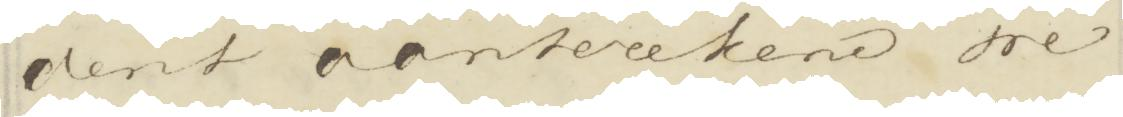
dent aanterekene we
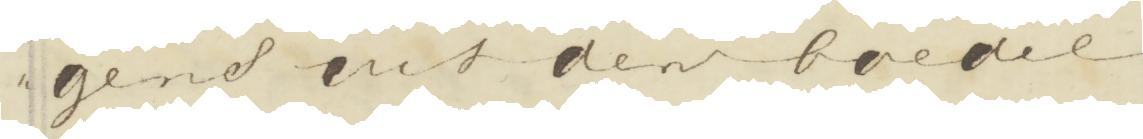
„gens uit den boedel
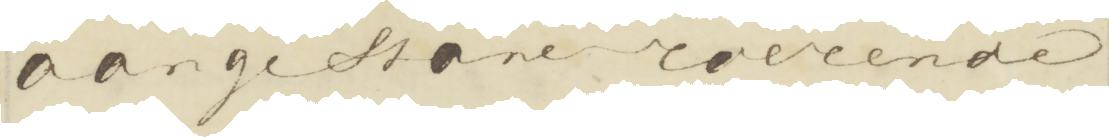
aangestane roerende
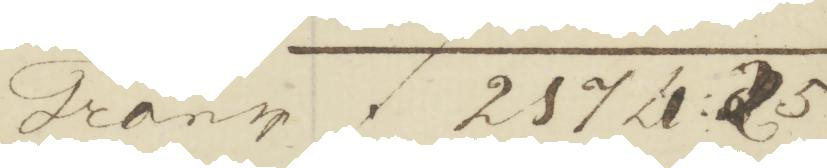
Transp ƒ 2174: 25
